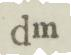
dm
